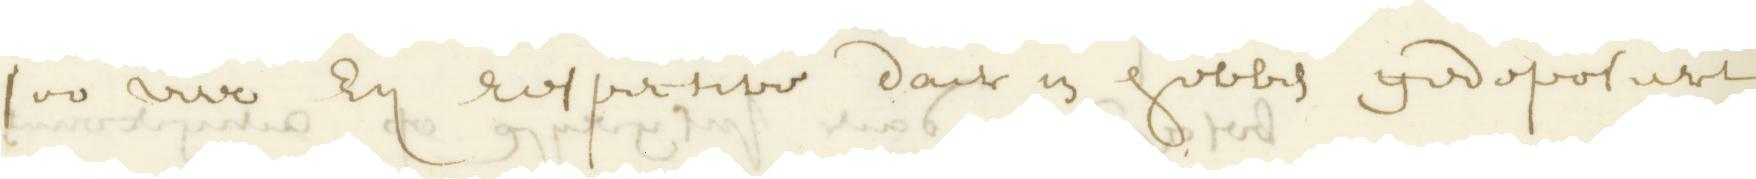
soo voor hij respactive daer in hebben gedeposiert
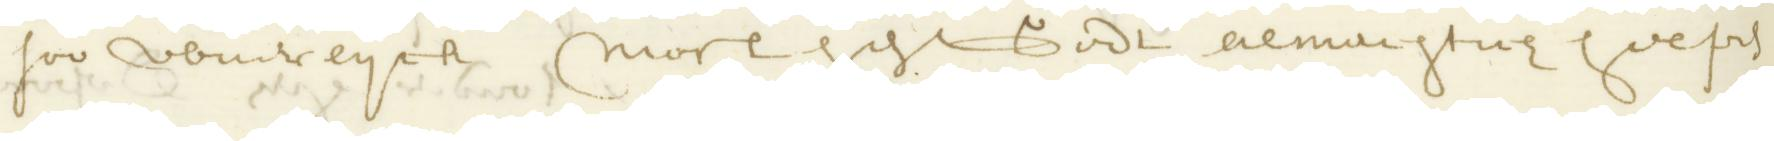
soo waerlijck most hijt sodt almachtich helpen
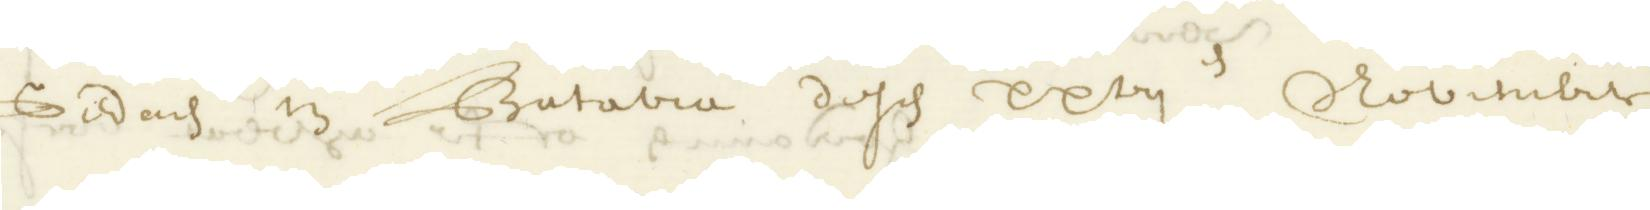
sedach in Batavia desen xxvij en November
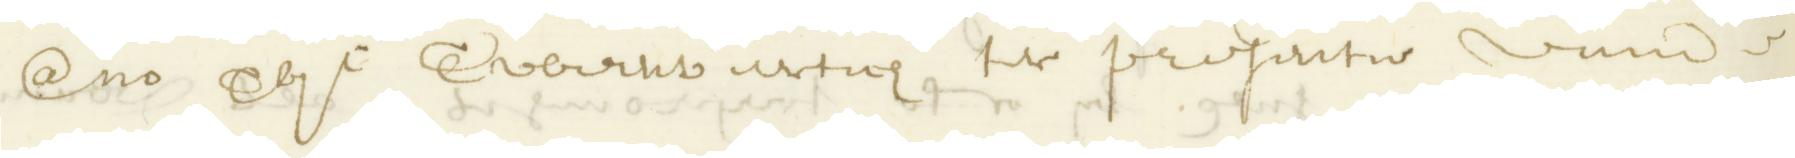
@no xvijc Tweente eertich ter presentie vande
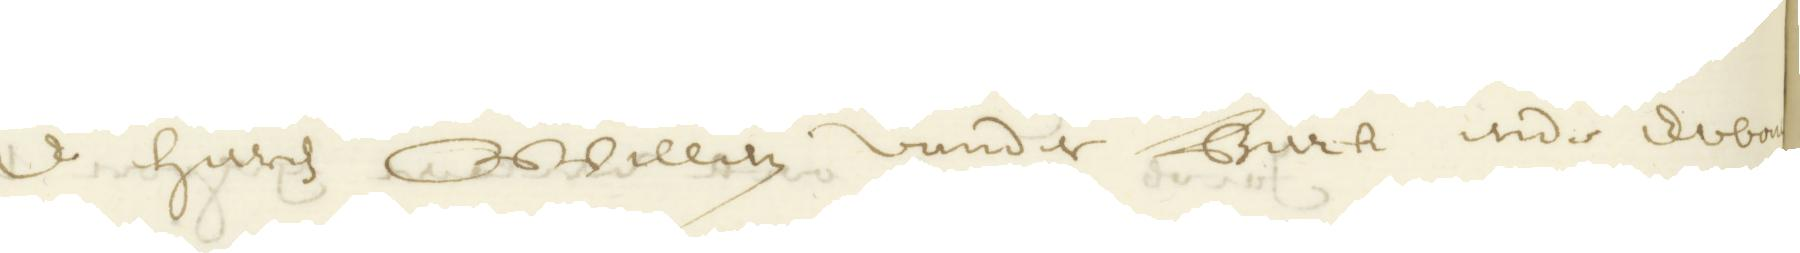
de heeren willem vander Beeck inde Ewon
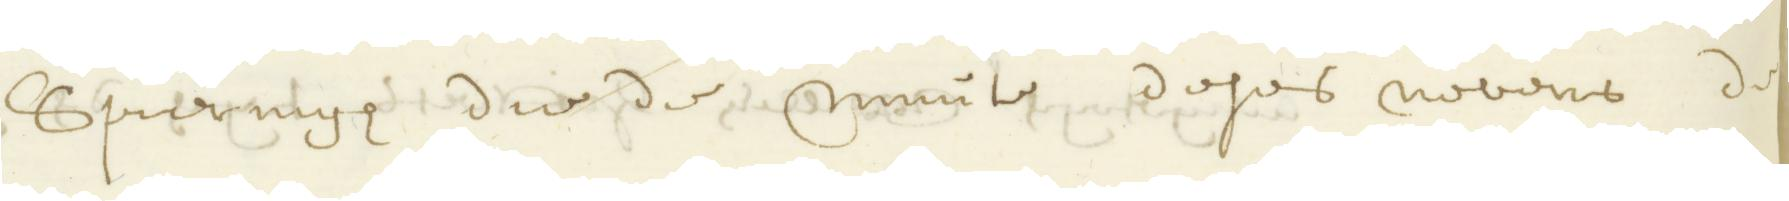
spreringen die de munte deses nevens de
